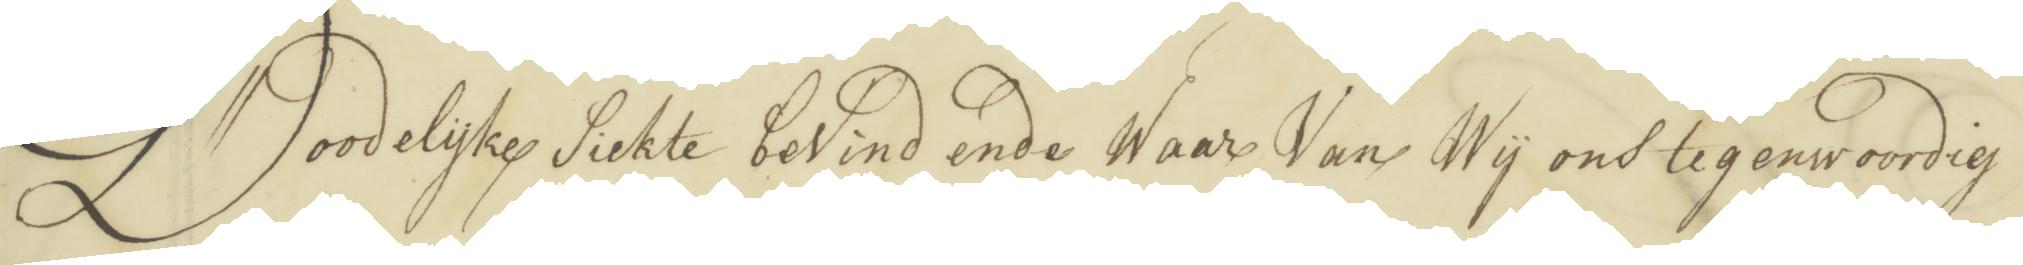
Doodelijke siekte bevind ende waar van wij ons tegenwoordig
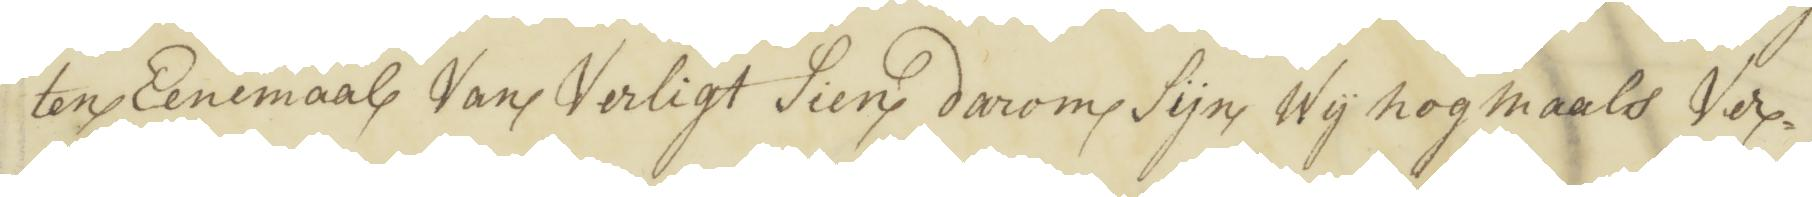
ten Eenemaal van verligt sien darom sijn wij nog maals ver„
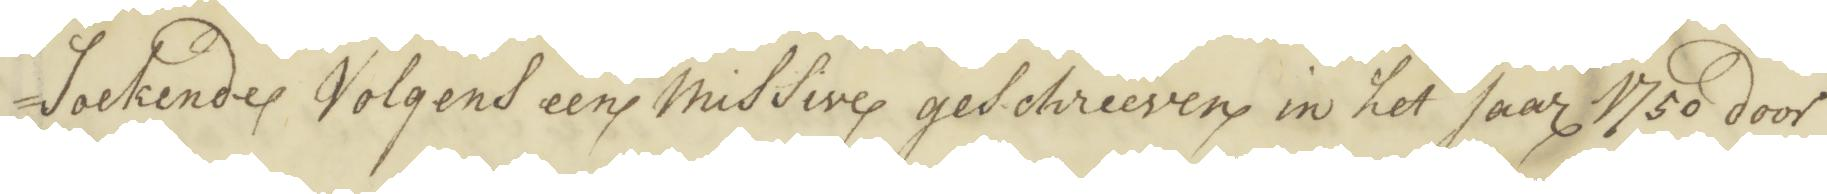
=soekende volgens een missive geschreeven in het jaar 1750 door
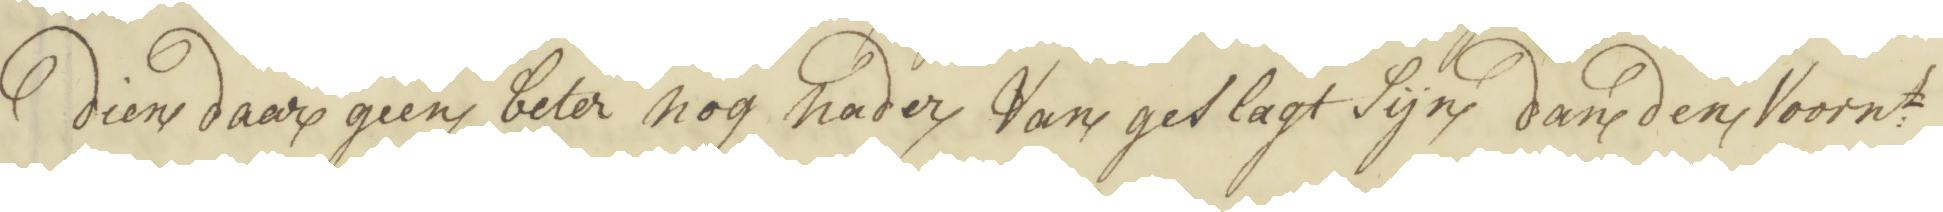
dien daar geen beter nog nader van geslagt sijn dan den voorn:t
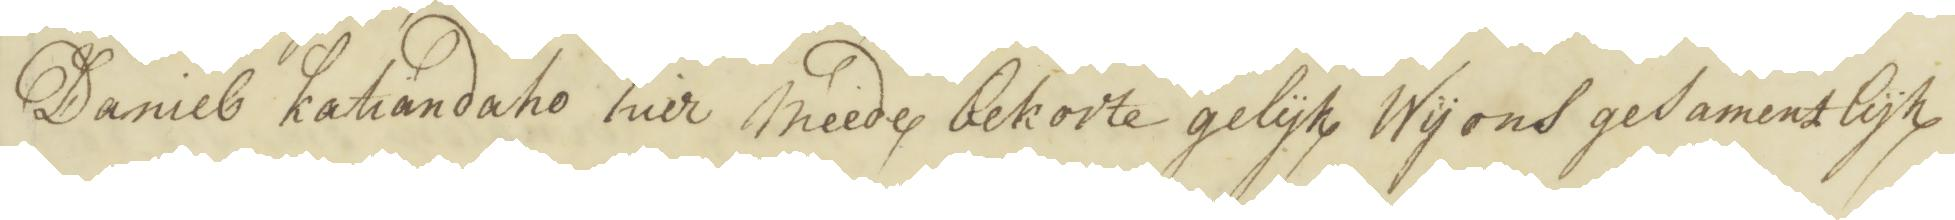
Daniel katiandaho hier meede bekorte gelijk wij ons gesamentlijk
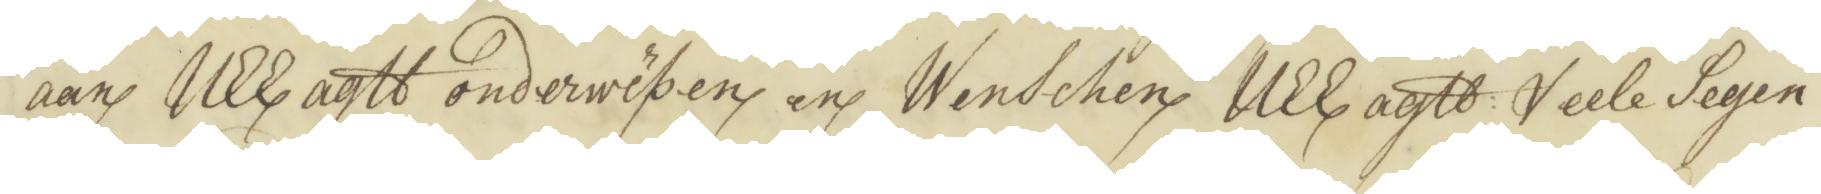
aan UEE agtb onderwerpen en wenschen UEE agtb: veele segen
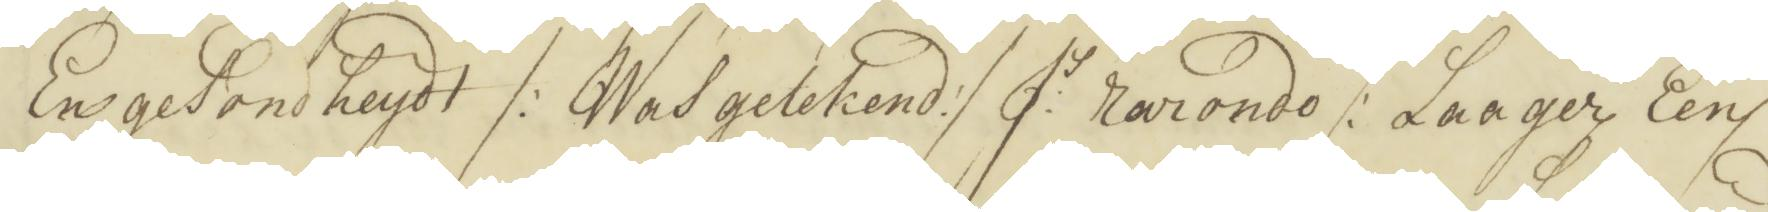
En gesondheydt /: was getekend:/ J:s rarondo /: Laager Een
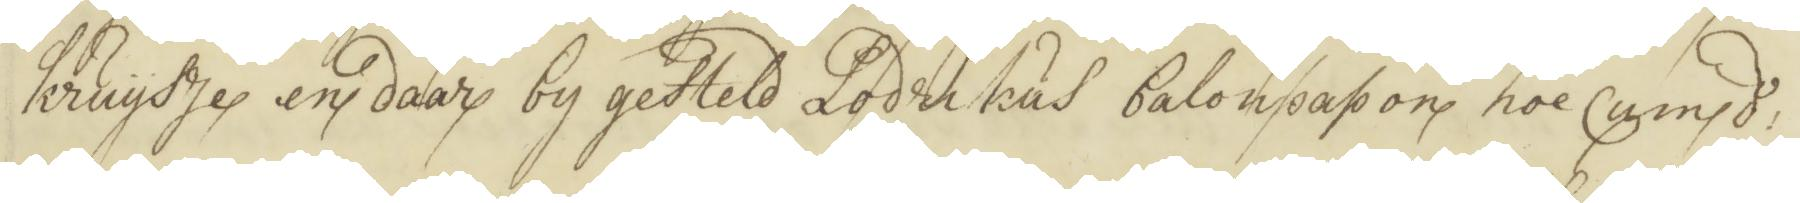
kruijsje en daar by gesteld Lodrikus baloupapon hoecum d:o
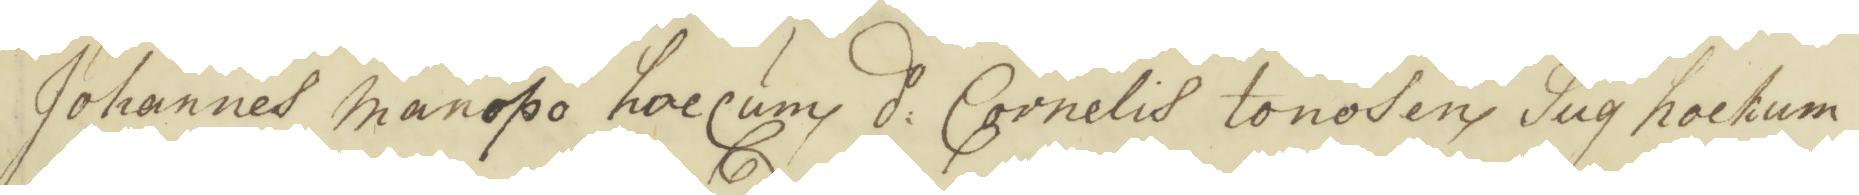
Johannes manopo hoecum d:o Cornelis tonosen sug hoekum
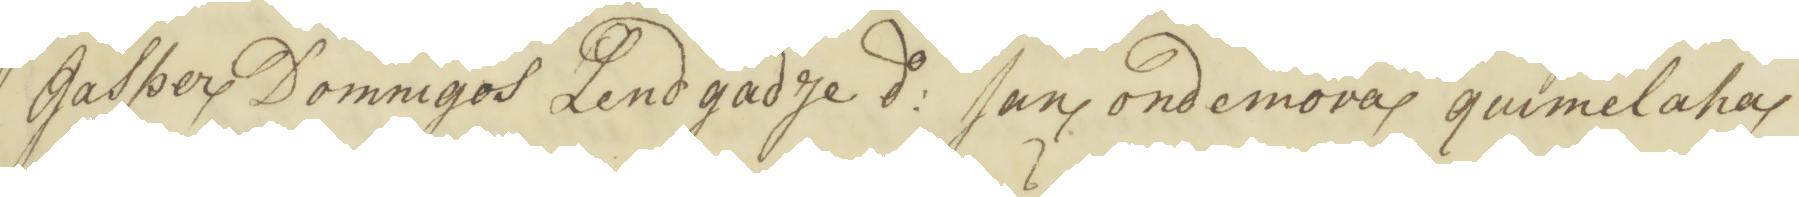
Gasper Domnigos Lend gadje d:o Jan ondemova quimelaha
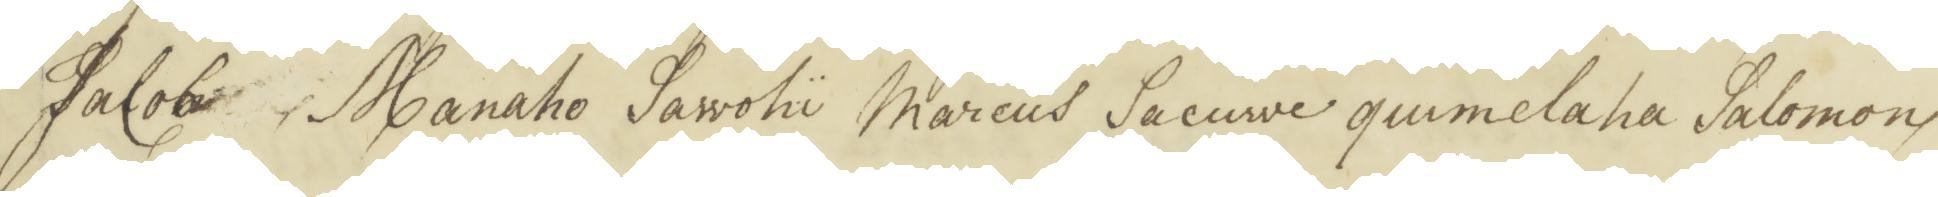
Jacob: Manaho Sawohi Marcus Sacuwe quimelaha Salomon
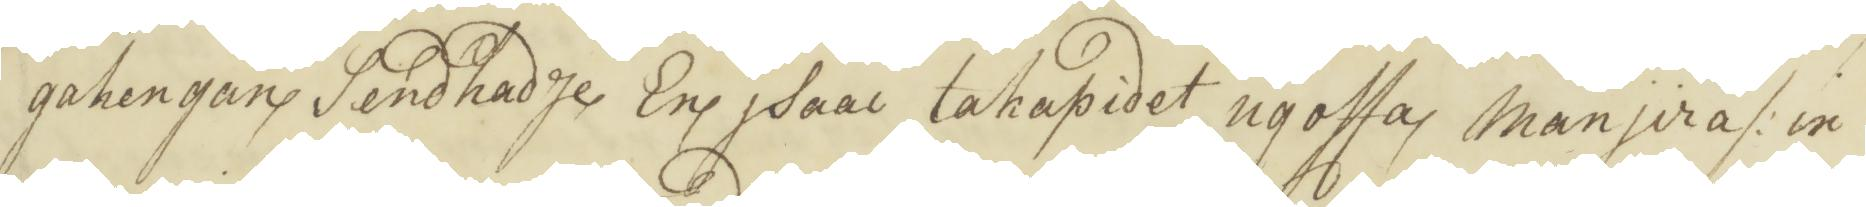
gahengan Sendhadje En jsaai tahapidet ug offa manjira /: in
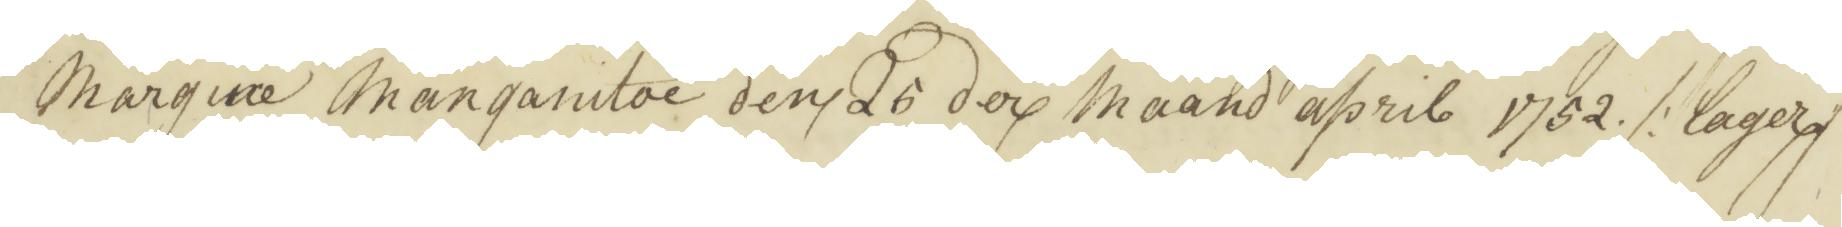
margine manganitoe den 25 der maand april 1752. /:lager/
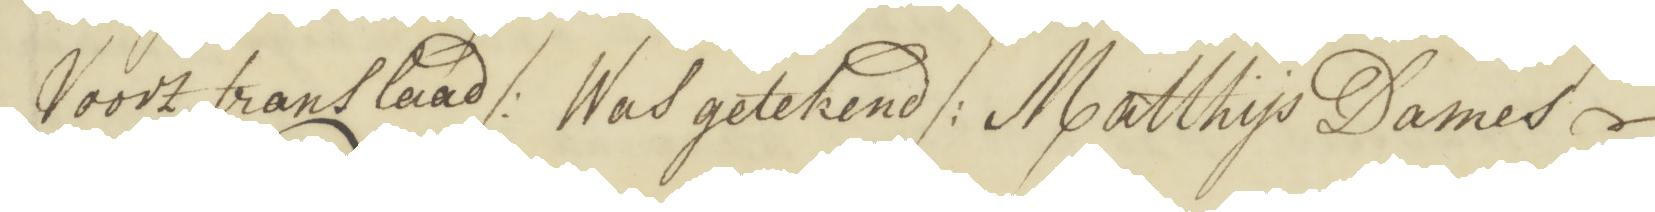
voort translaad /: Was getekend /: Matthijs Dames
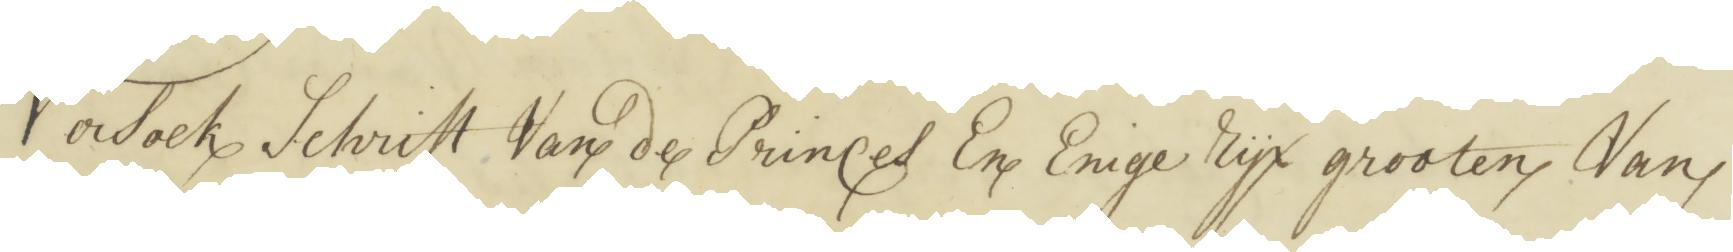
Versoek schrift van de Princes En Enige rijx grooten van
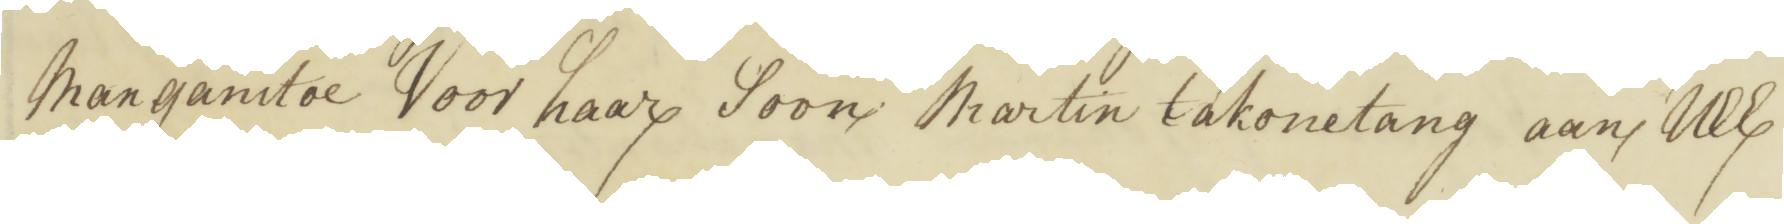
manganitoe voor haar soon martin takonetang aan UEE
